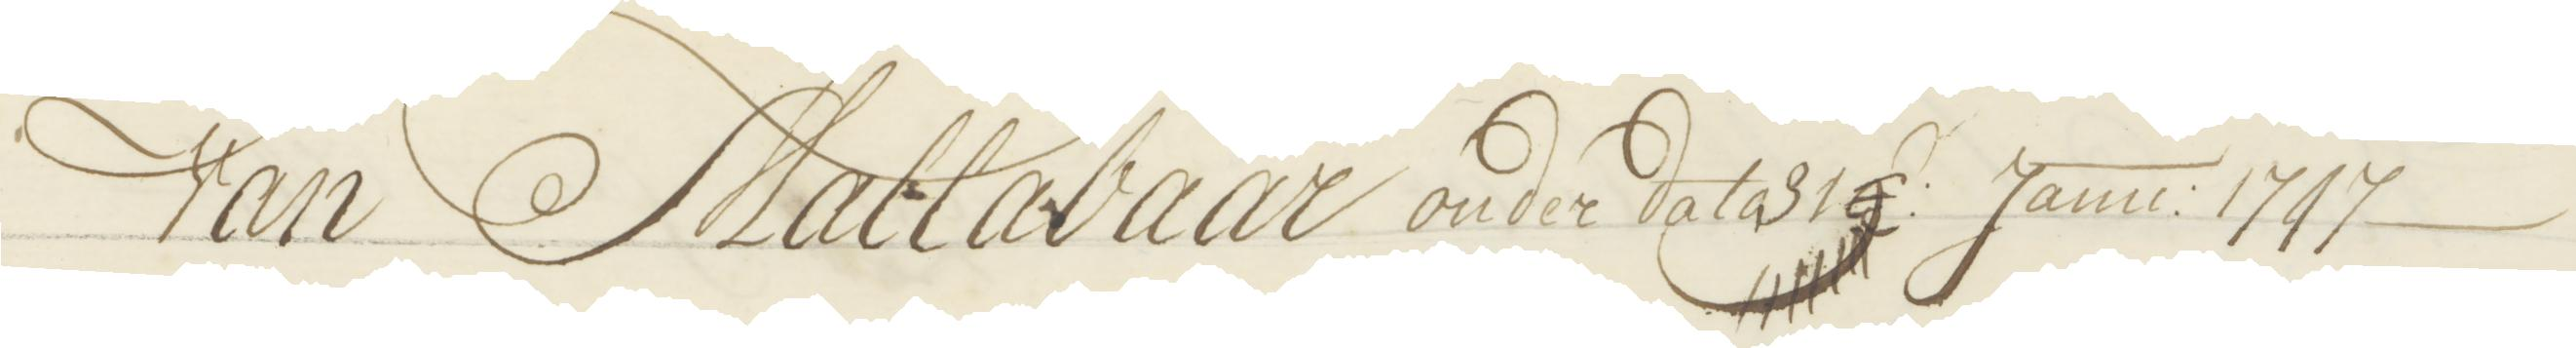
Van Mallabaar onder dato 319:' Jann: 1747 —
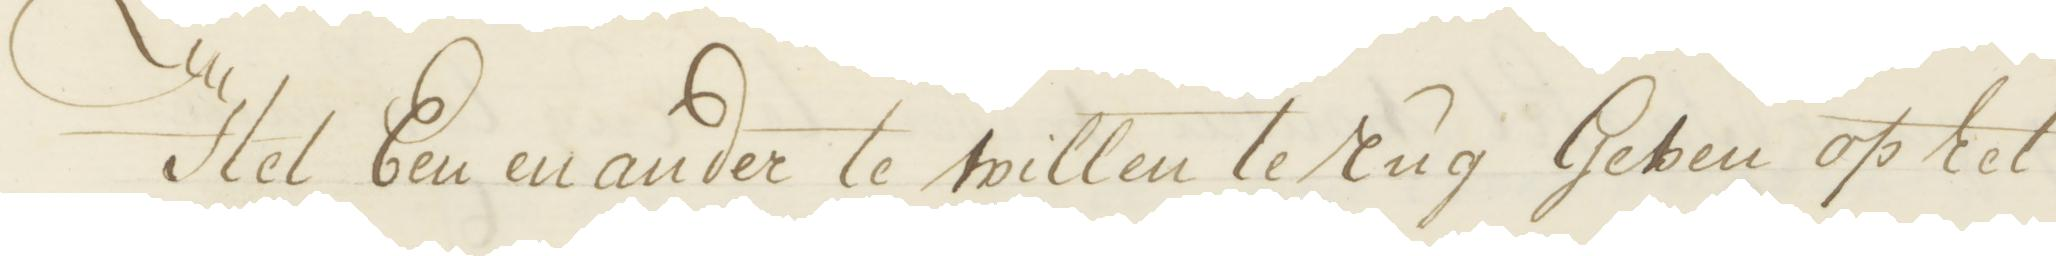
Het Een en ander te willen te rug Geven op het
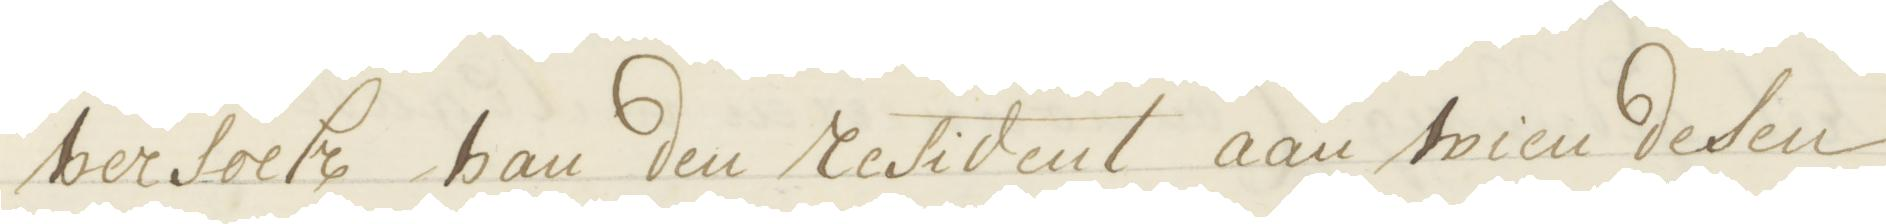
versoek van den resident aan wien desen
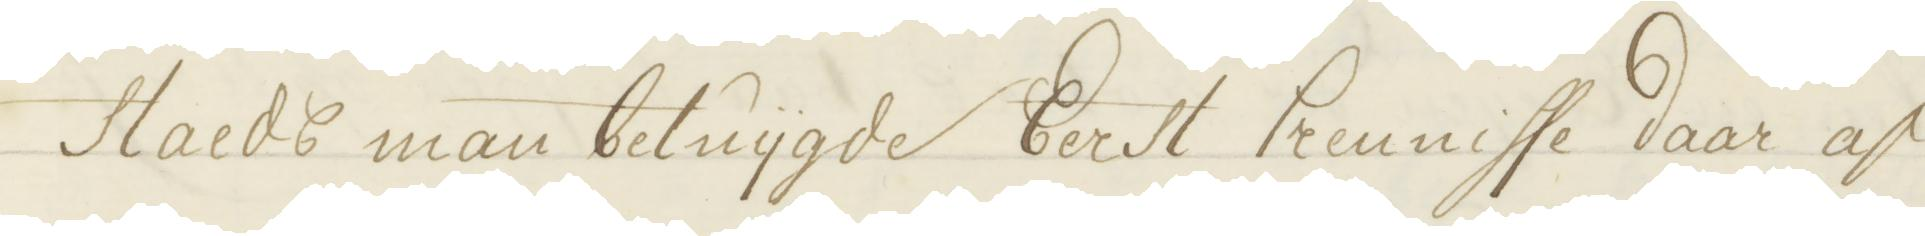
staeds man betuijgde Eerst kennisse daar af
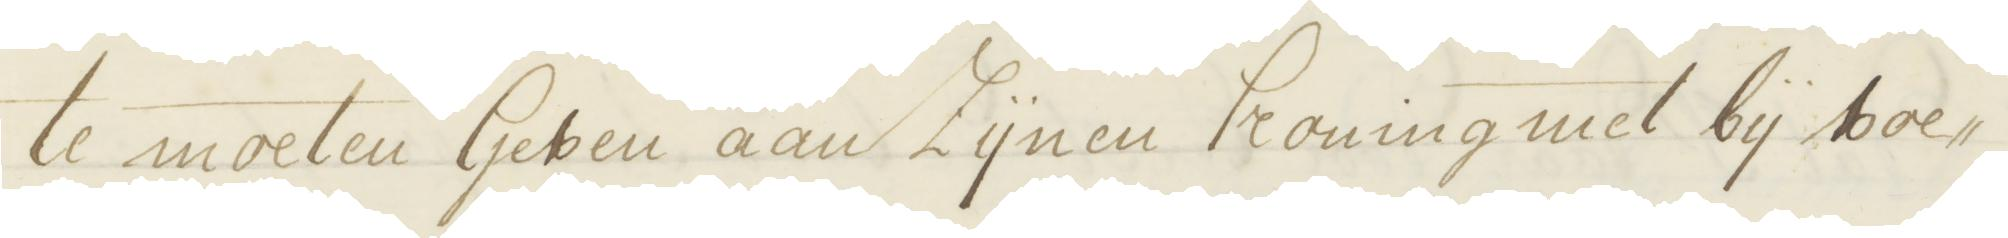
te moeten Geven aan Zijnen koning met bij voe„
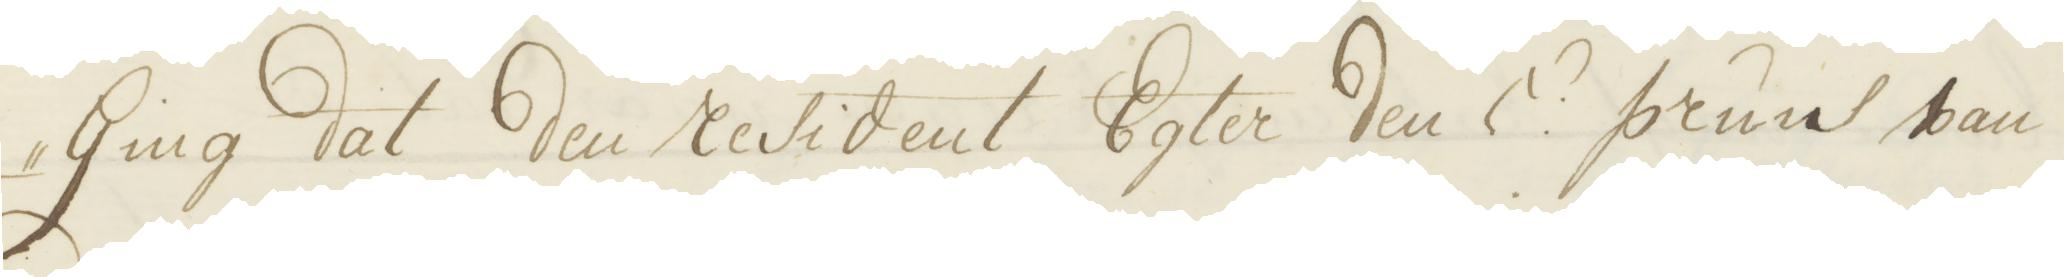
„ging dat den resident Egter den 5:' pruns van
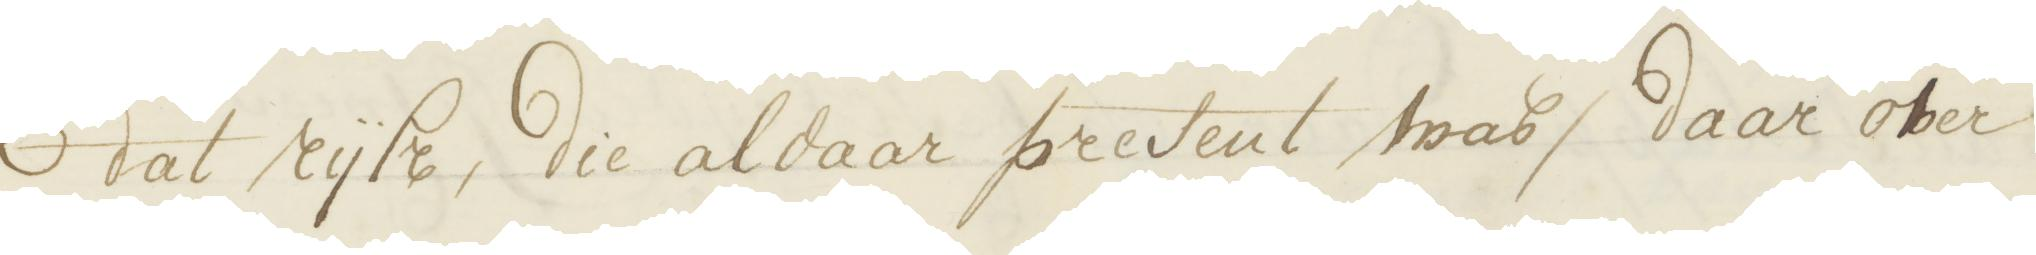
dat rijk, die aldaar present was/ daar over
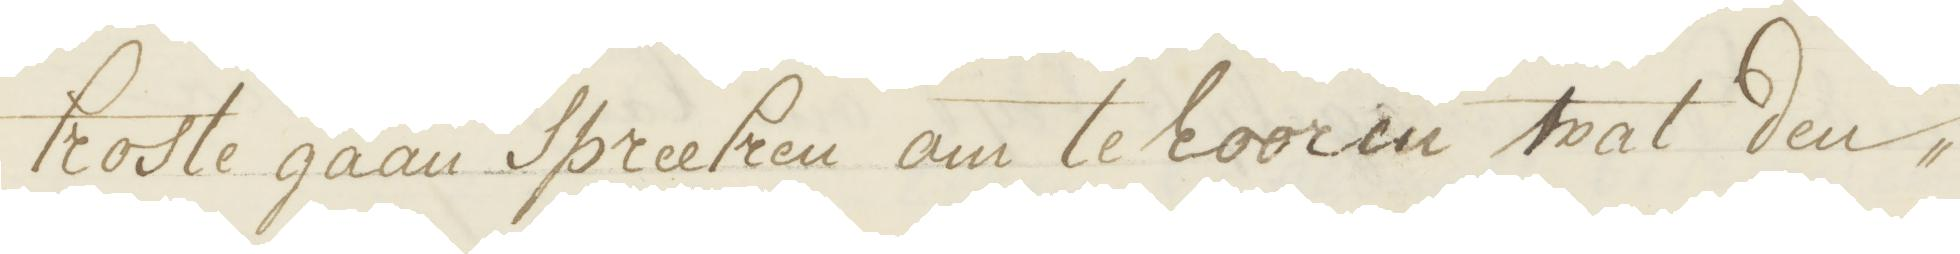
koste gaan spreeken om te hooren wat den„
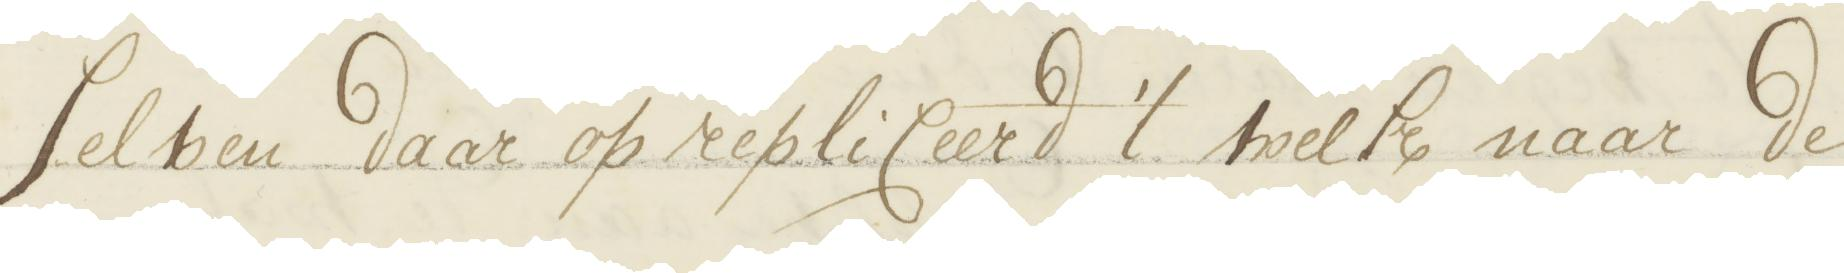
selven daar op repliceerd ’t welk naar de
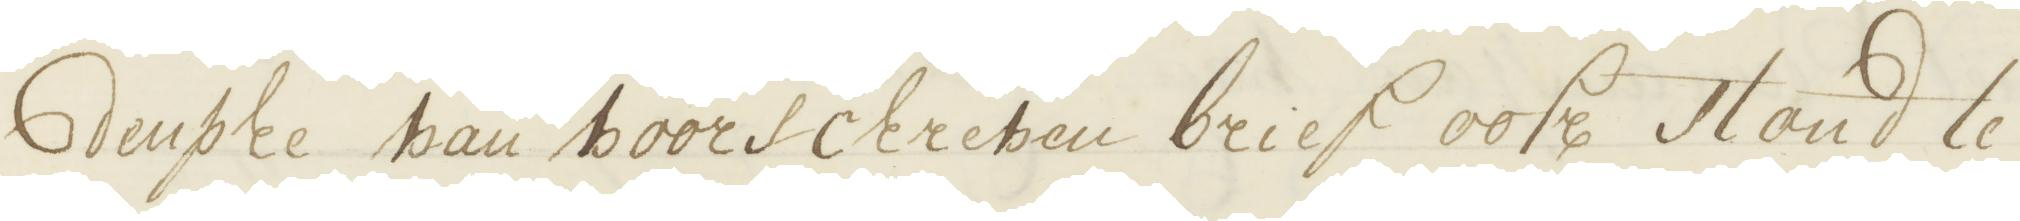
denphe van voorschreven brief ook stond te
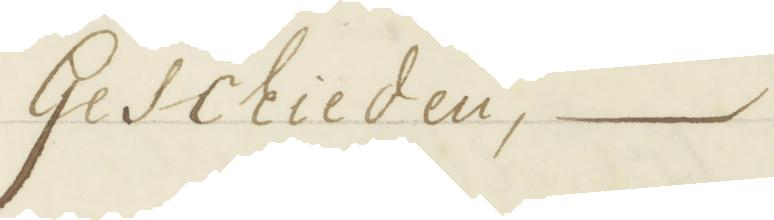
geschieden; —
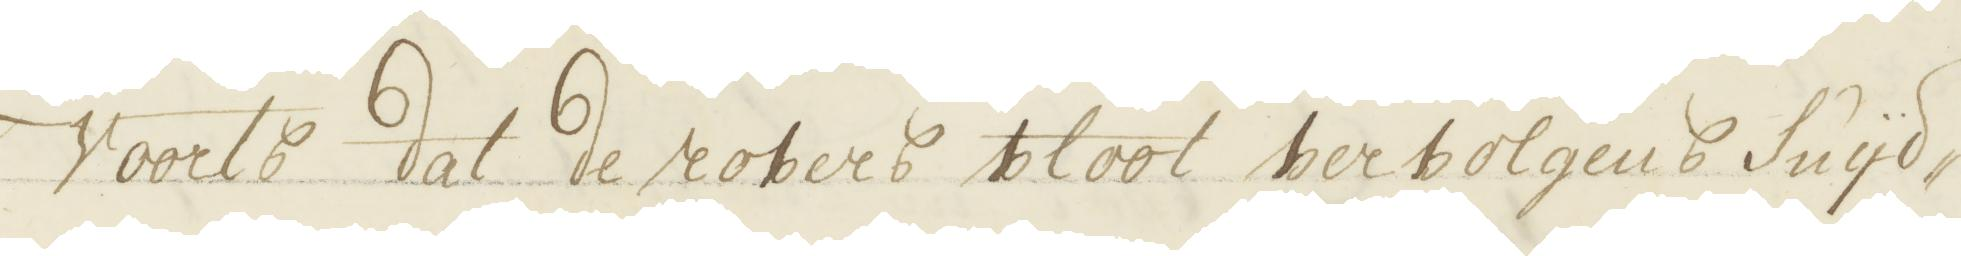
Voorts dat de rovers vloot vervolgens suijd„
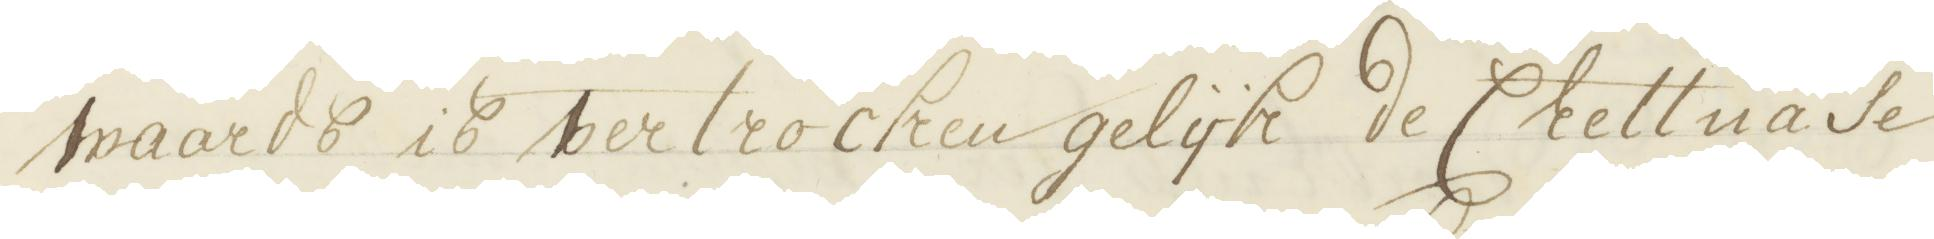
waards is vertrocken gelijk de Chettuase
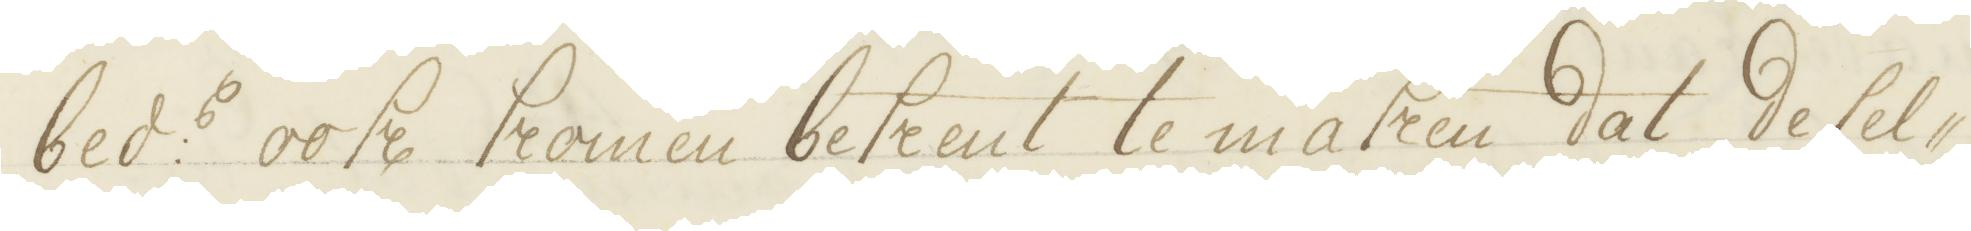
bed:s ook komen bekent te maken dat de sel„
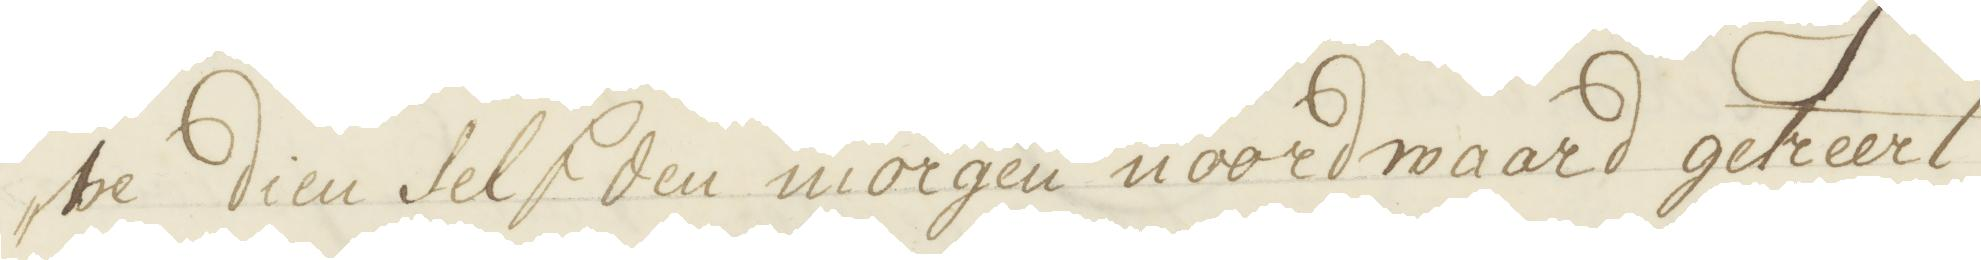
„ve dien selfden morgen noordwaard gekeert
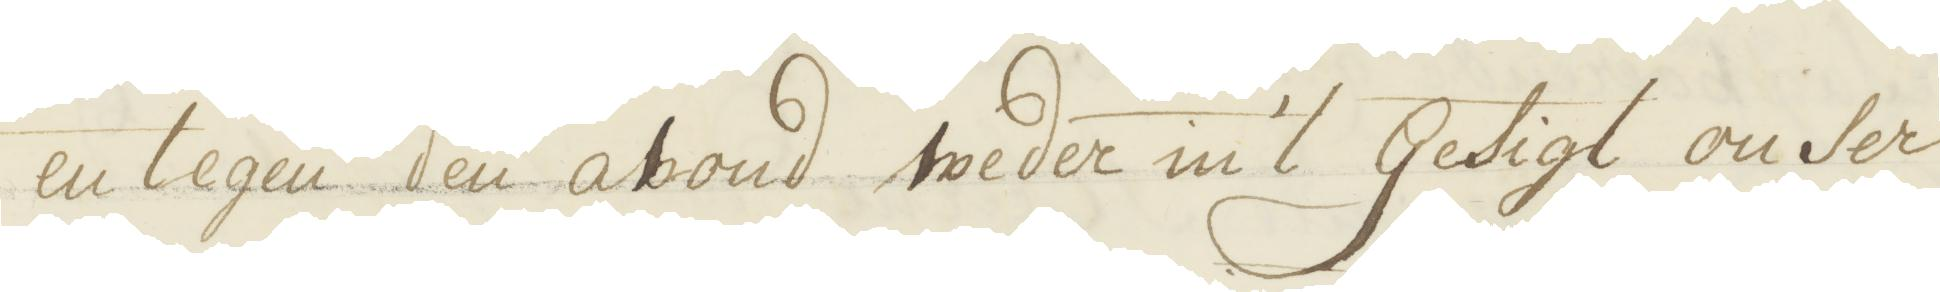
en tegen den avond weder in ’t gesigt onser
